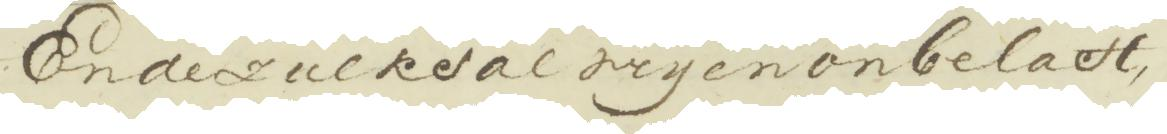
Ende zulks al vry en onbelast,
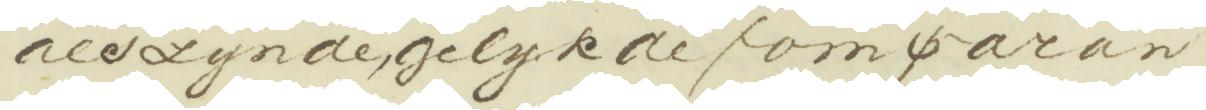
als zynde, gelyk de Comparan
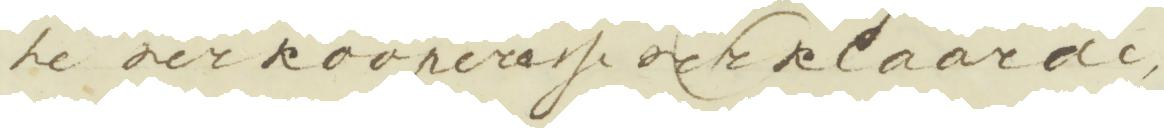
te verkooperesse verklaarde,
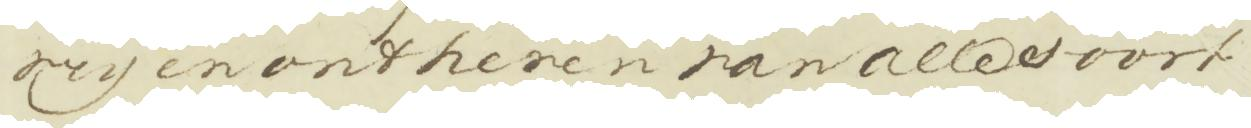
vry en ontheven van alle soort
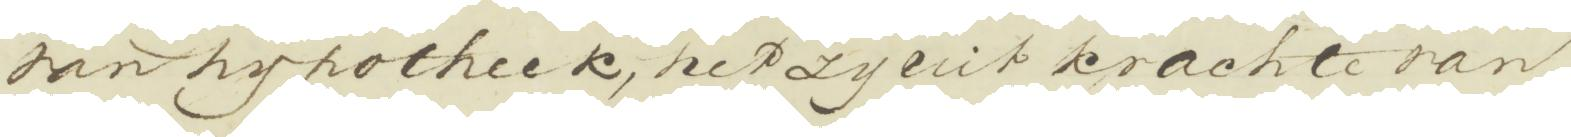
van hypotheek, het zy uit krachte van
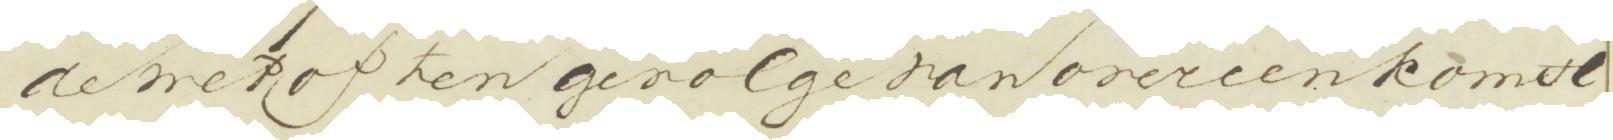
de wet of ten gevolge van overeenkomst
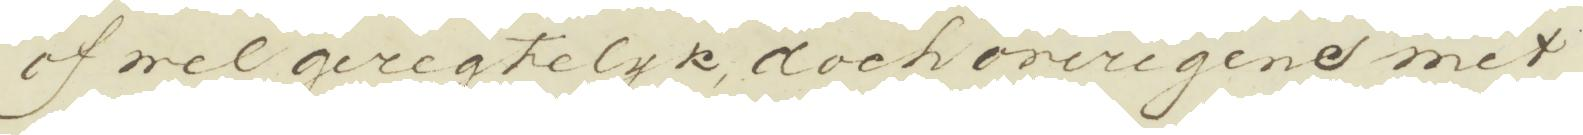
of wel geregtelyk, doch overigens met
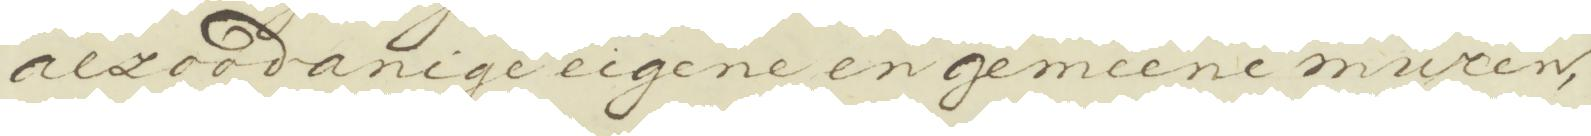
alzoodanige eigene en gemeene muren,
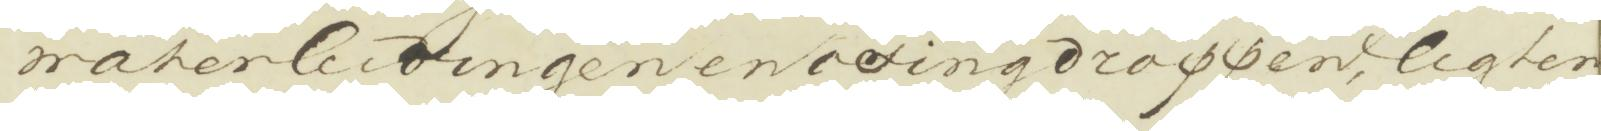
waterleidingen en osingdroppen, ligten
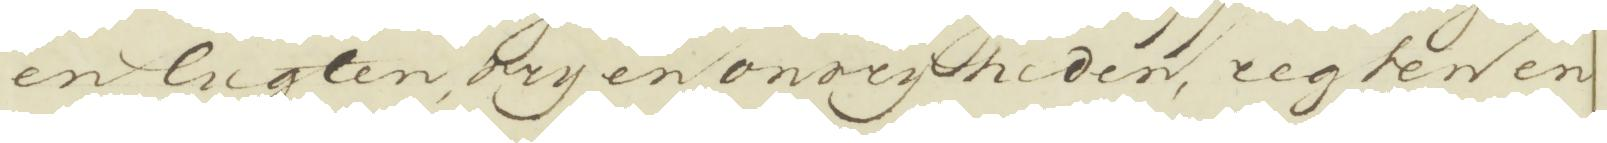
en lugten, vry en onvryheden, regten en
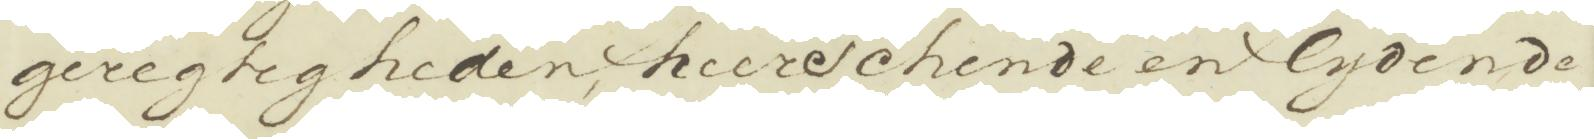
geregtigheden, heerschende en lydende
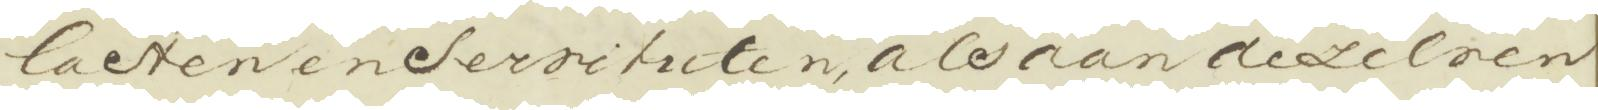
lasten en servituten, als aan dezelven
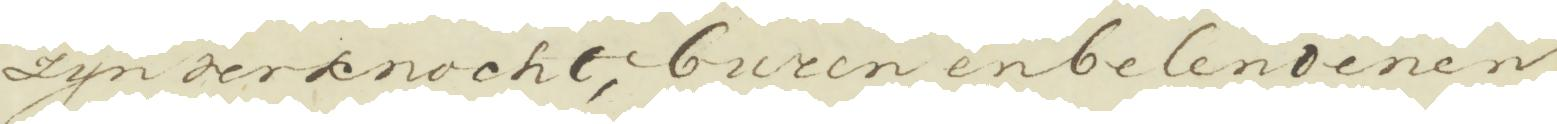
zyn verknocht, buren en belendenen
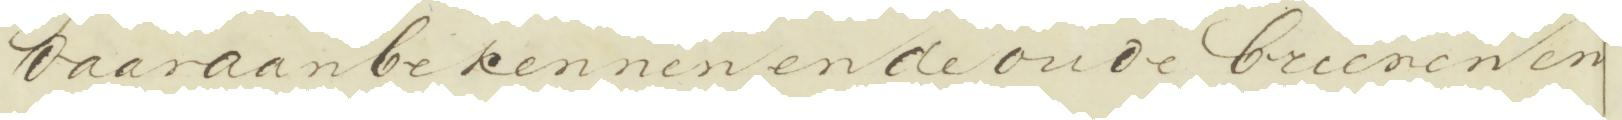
daaraan bekennen en de oude brieven en
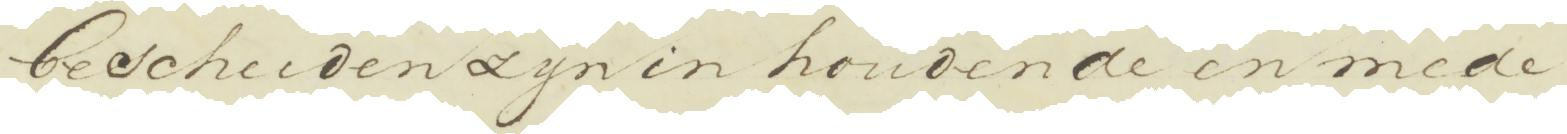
bescheiden zyn in houdende en mede
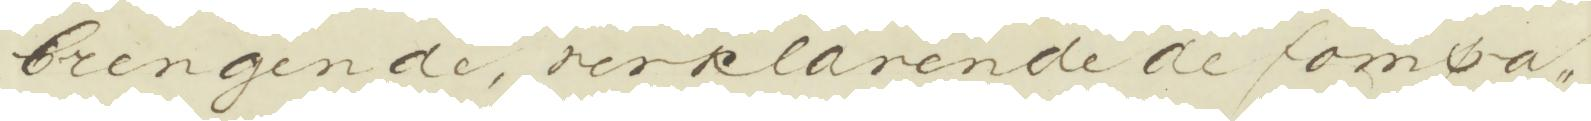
brengende, verklarende de Compa„
